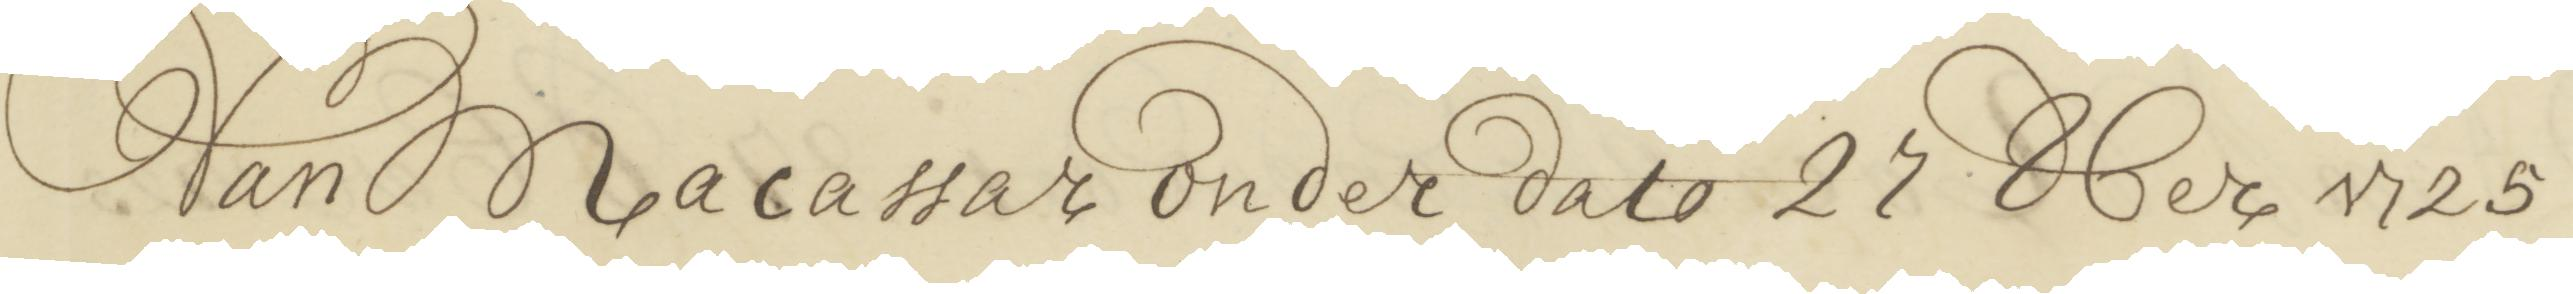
Van Macassar onder dato 27 8ber 1725
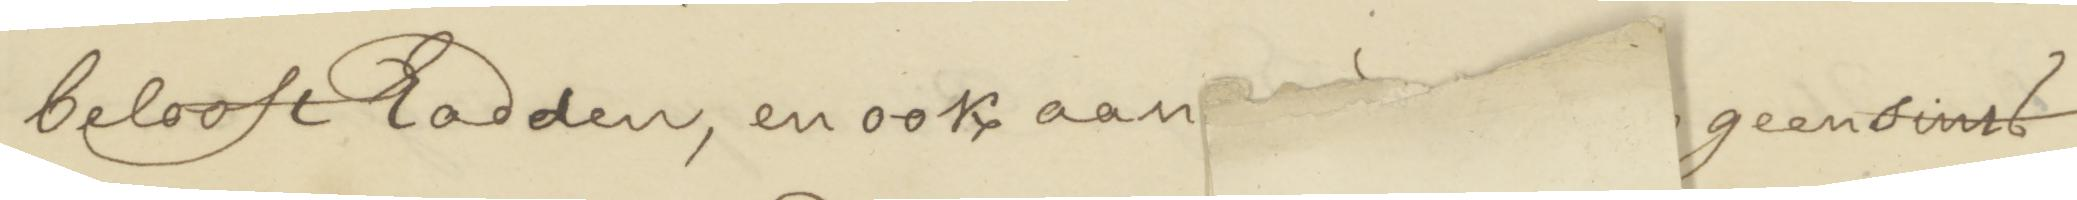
belooft hadden, en ook aan geensints
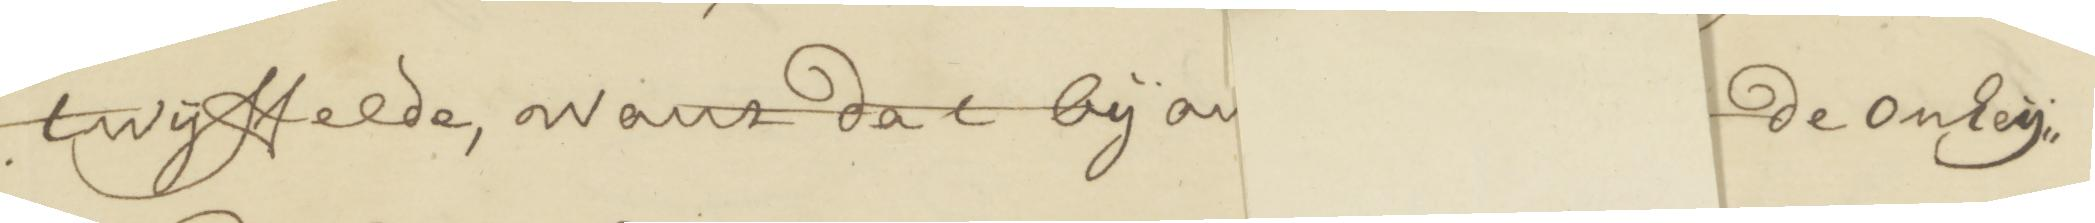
twijffelde, want dat bij an de onheij„
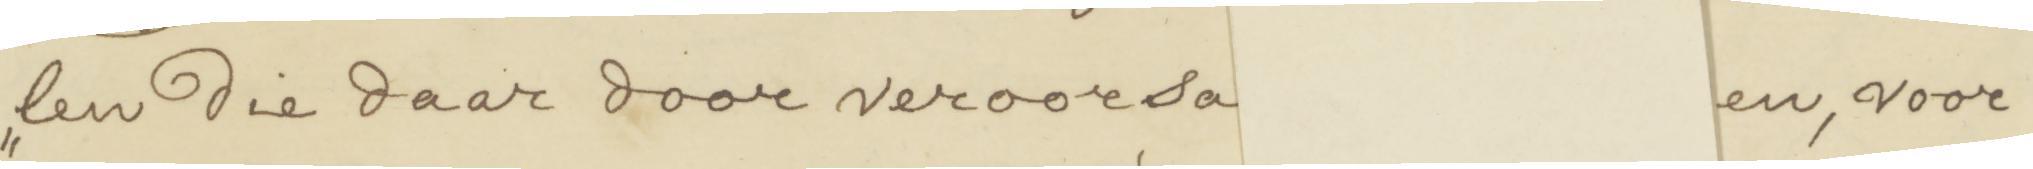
„len die daar door veroorsa en, voor
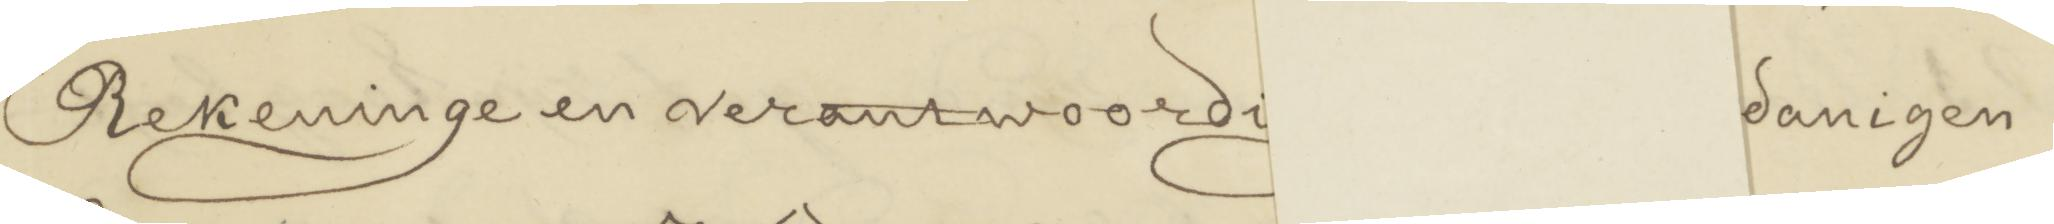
Rekeninge en verantwoordi danigen
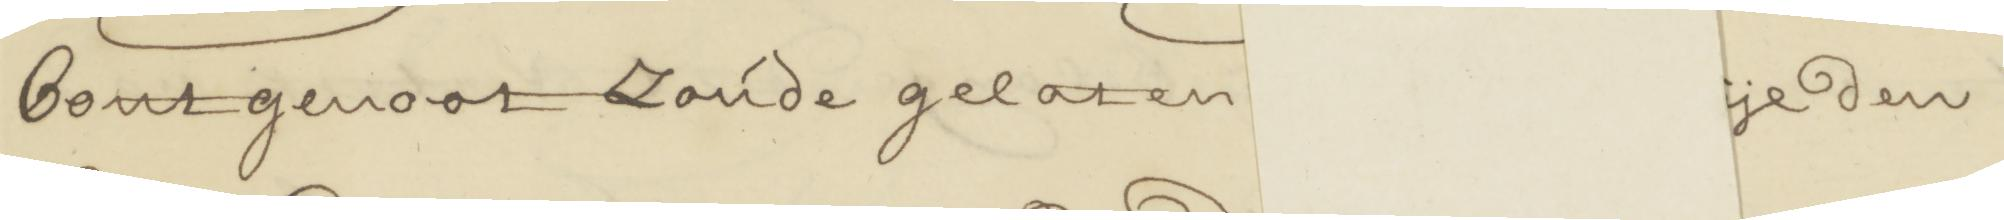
bontgenoot zoude gelaten ije den
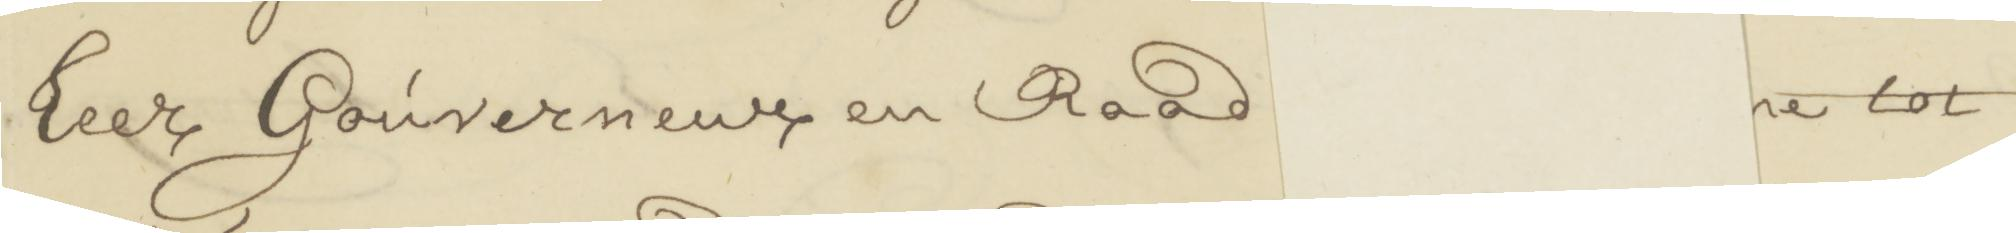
heer Gouverneur en Raad ie tot
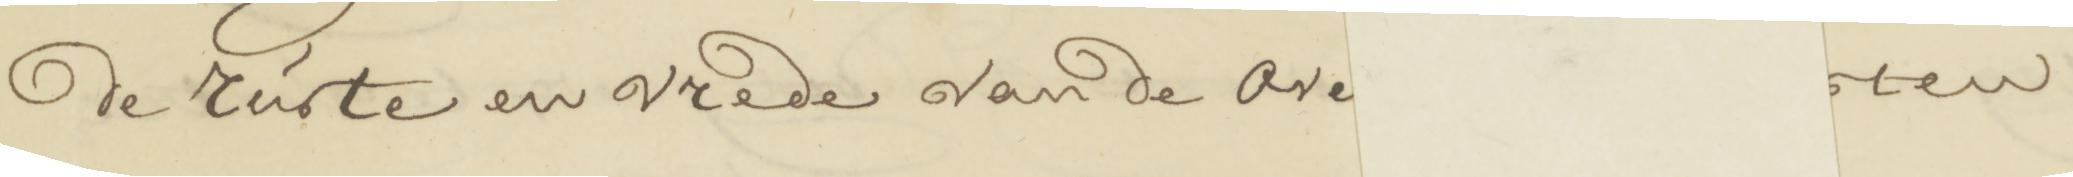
de ruste en vrede van de ave ten
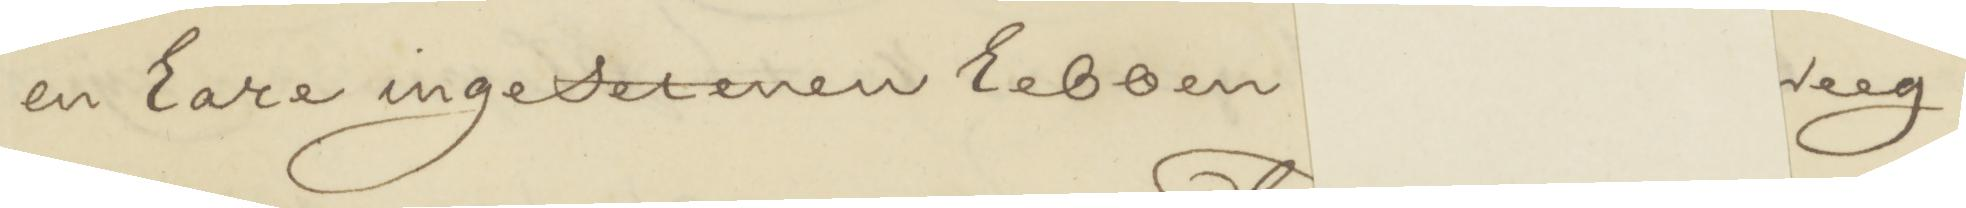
en hare ingesetenen hebben veeg
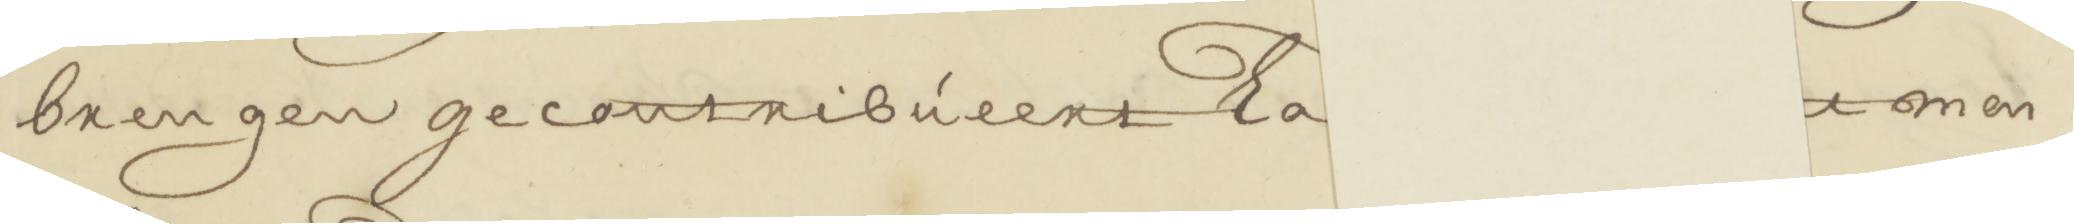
brengen gecontribueert ha t men
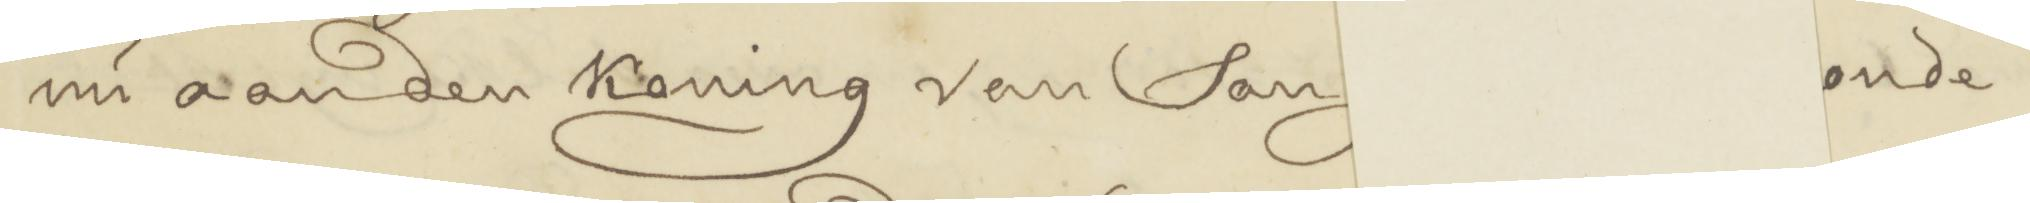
nu aan den koning van san onde
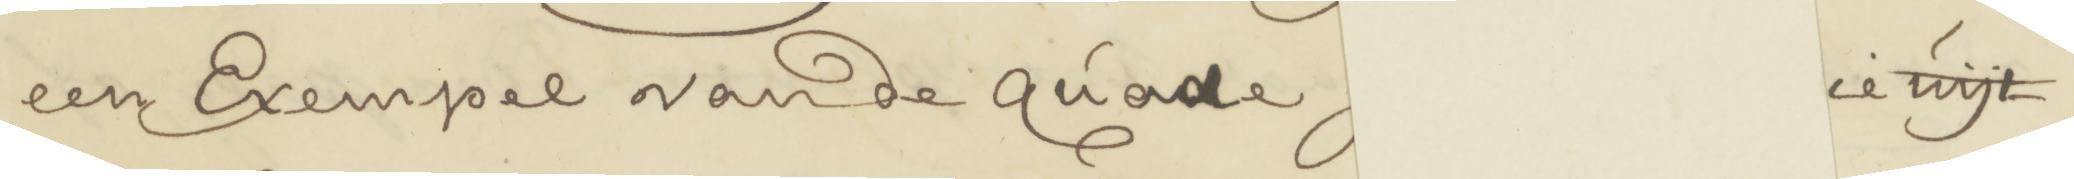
een Exempel van de quade ie uijt
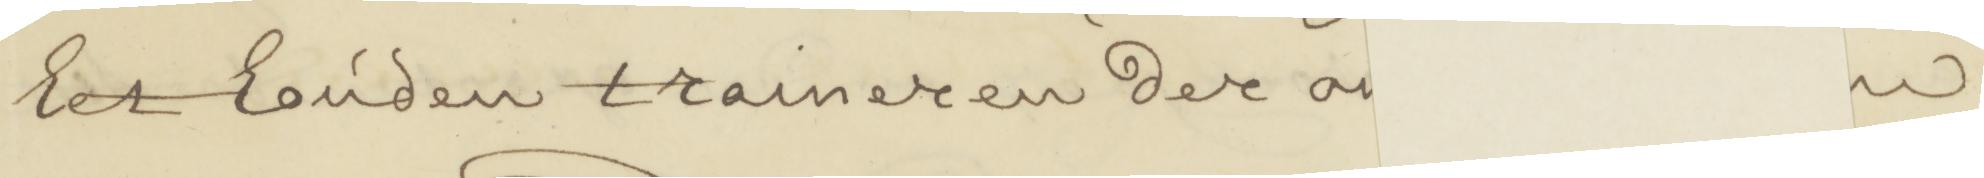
het houden traineren der oi n
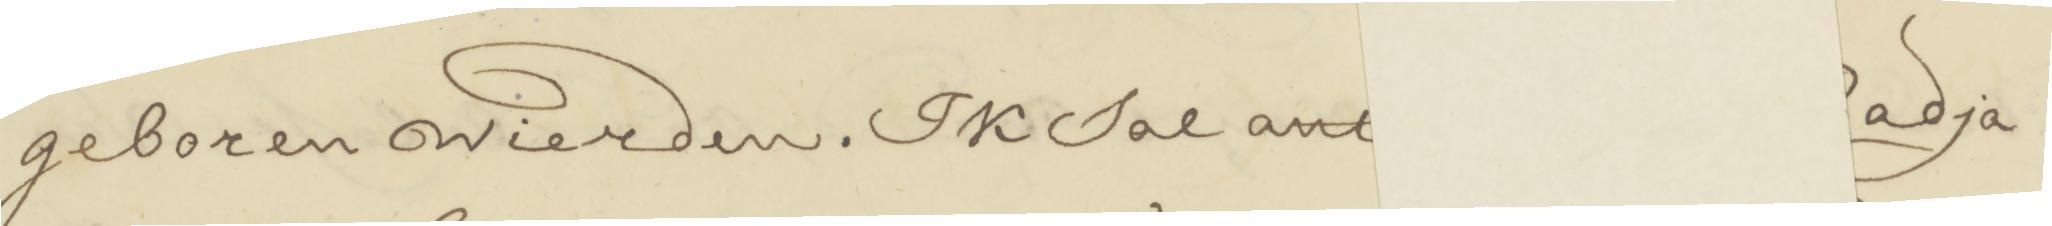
geboren wierden. Ik sal ant adja
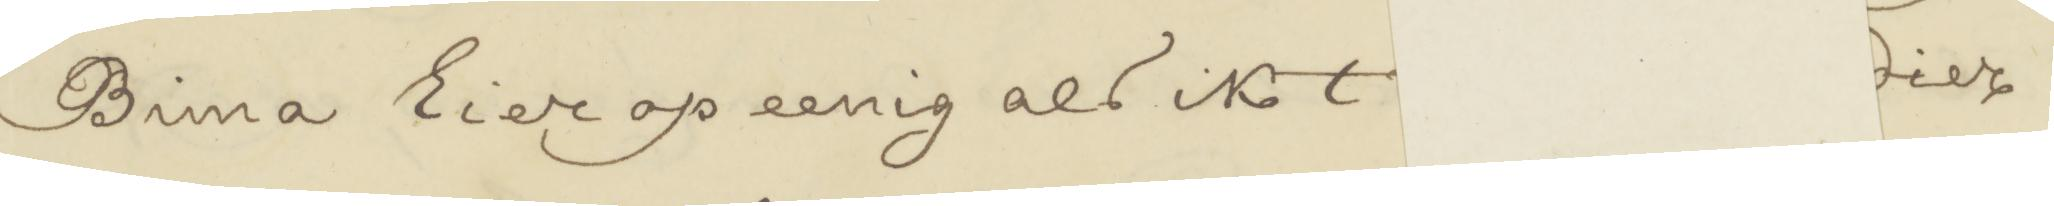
Bima hier op eenig als ikt dier
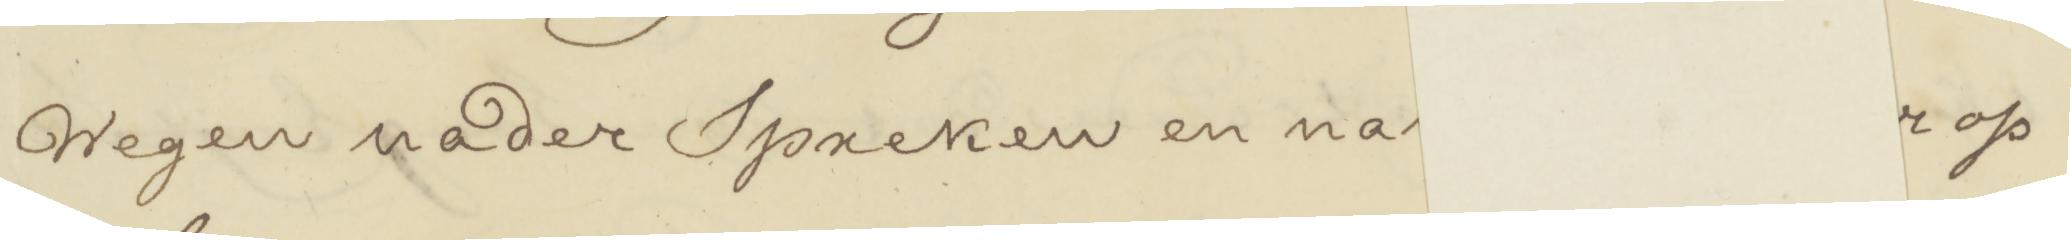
wegen nader spreken en na r op
